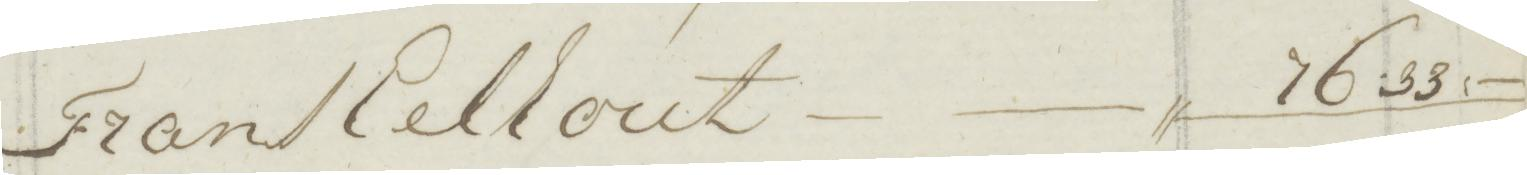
Frans Eelhout — — „ 76:33:—
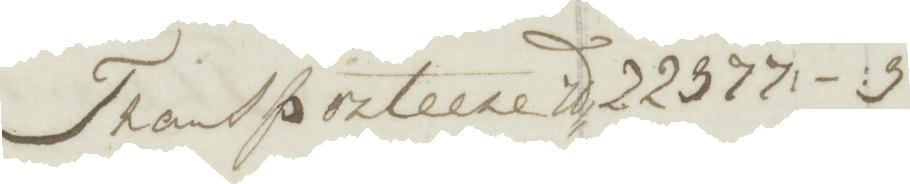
Transporteere rd„s 22377: – :3
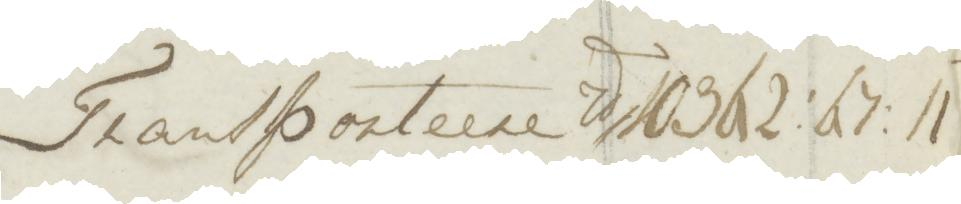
Transporteere rd„s 10342:47:11
